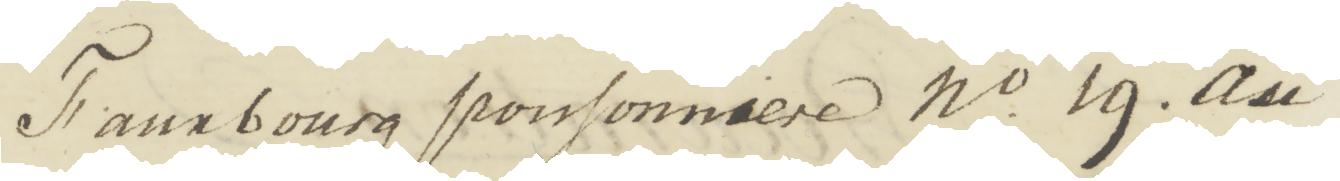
Faurbourg poissonniere N.o 19 Au
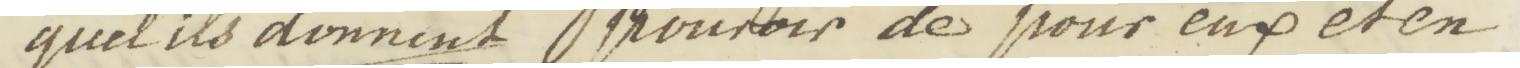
quel ils donnent pouvoir de pour eux et en
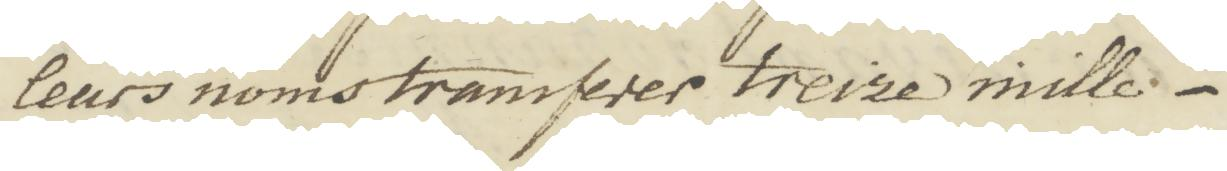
leurs noms transferer treize mille -
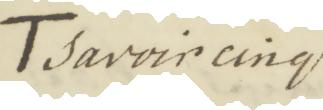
T savoir cinq
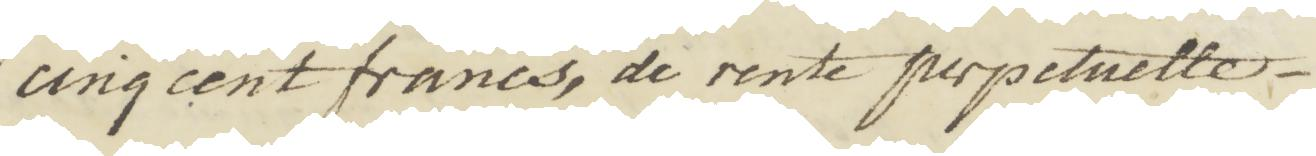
cinq cent francs, de rente perpetuelle -
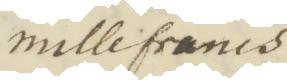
mille francs
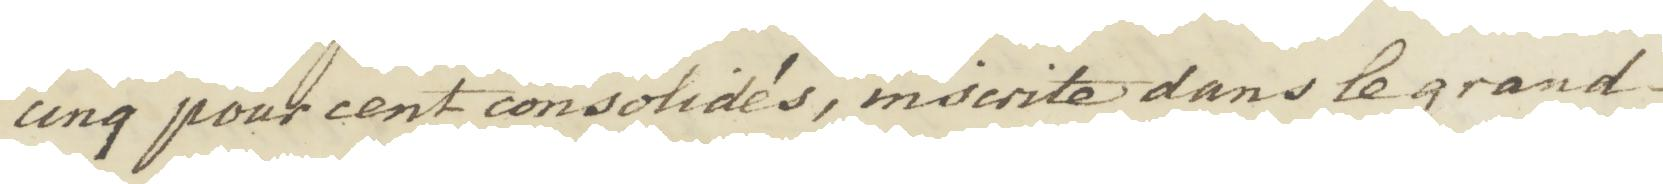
cinq pour cent consolidés, inscrite dans te grand
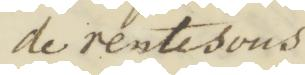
de rente sous
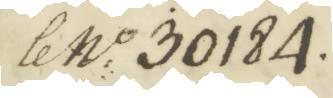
le N:o 30184.
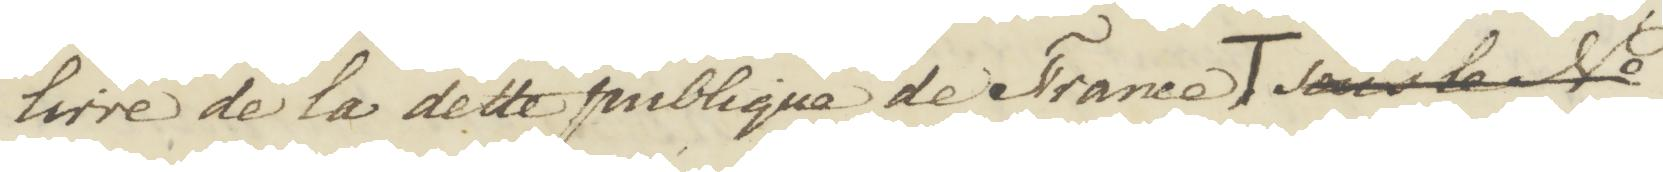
livre de la dette publique de France T sous le N.o
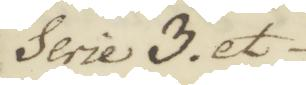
Serie 3:et
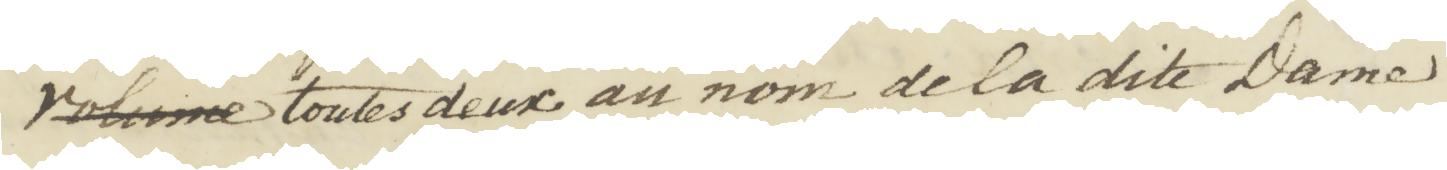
Volume toutes deux au nom de la dite Dame
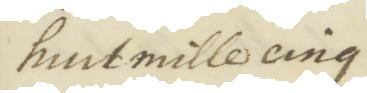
huit mille cinq
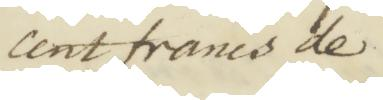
cent francs de
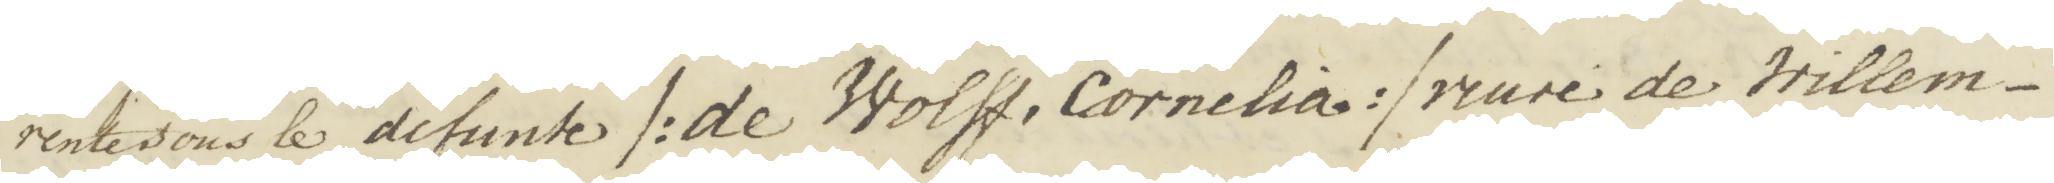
rente sons le defunte /: de Wolff. Cornelia. :/ vrure de Willem -
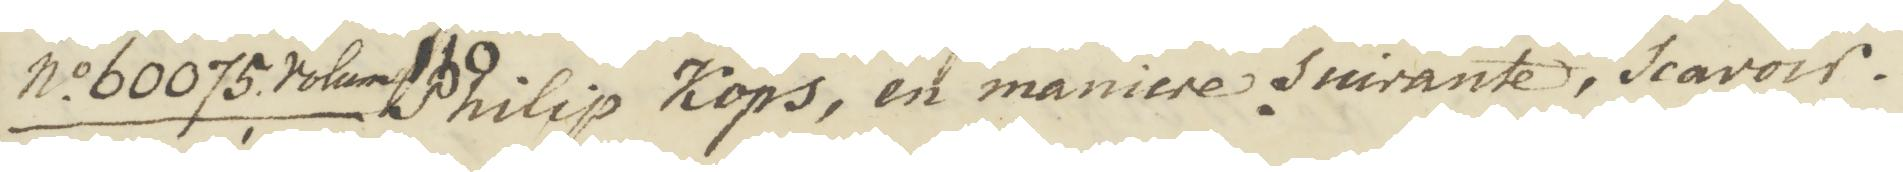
n.o 60075 volum 110 Philip Kops, en maniere suivante, scavoir.
